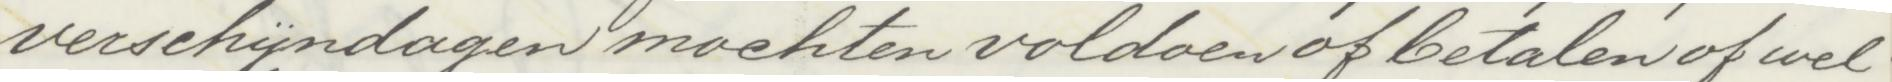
verschijndagen mochten voldoen of betalen of wel
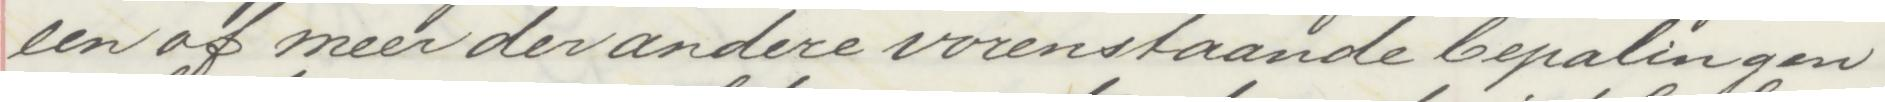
een of meer der andere vorenstaande bepalingen
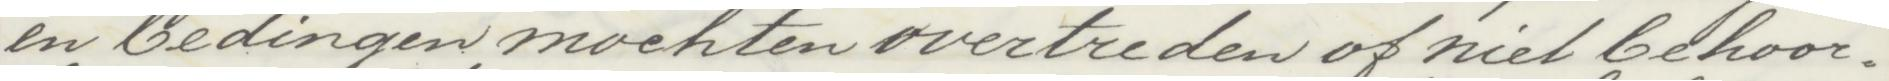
en bedingen mochten overtreden of niet behoor=
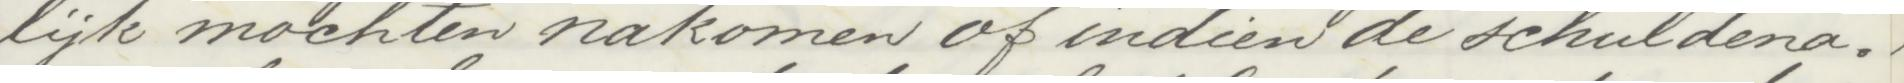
lijk mochten nakomen of indien de schuldena=
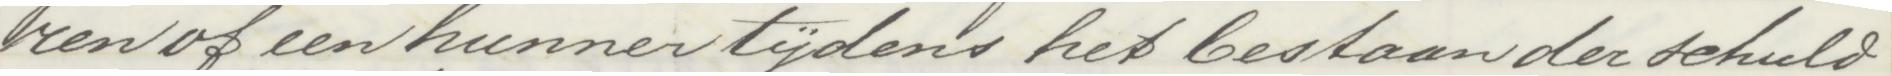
ren of een hunner tijdens het bestaan der schuld
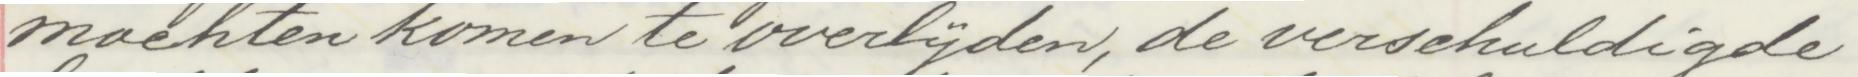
mochten komen te overlijden, de verschuldigde
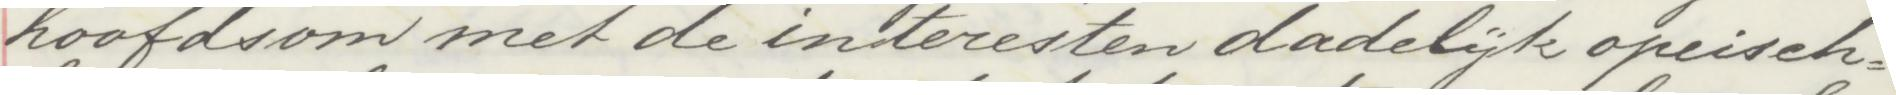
hoofdsom met de interesten dadelijk opeisch=
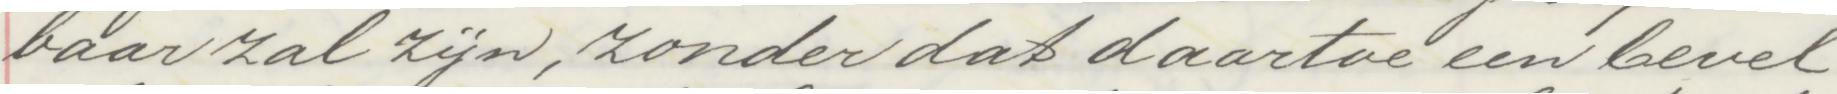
baar zal zijn, zonder dat daartoe een bevel
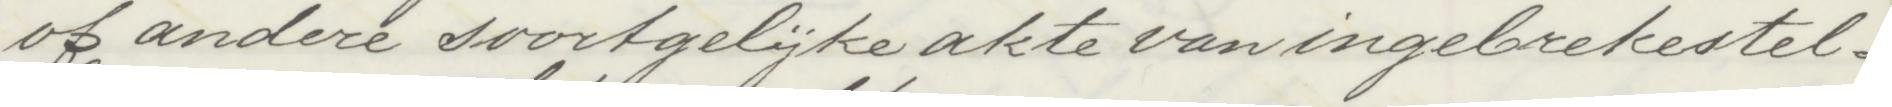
of andere soortgelijke akte van ingebrekestel=
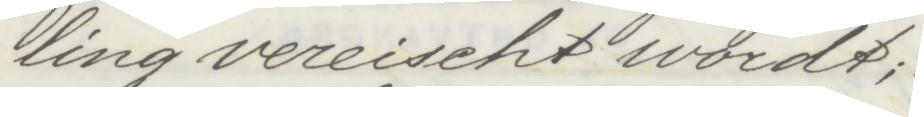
ling vereischt wordt;
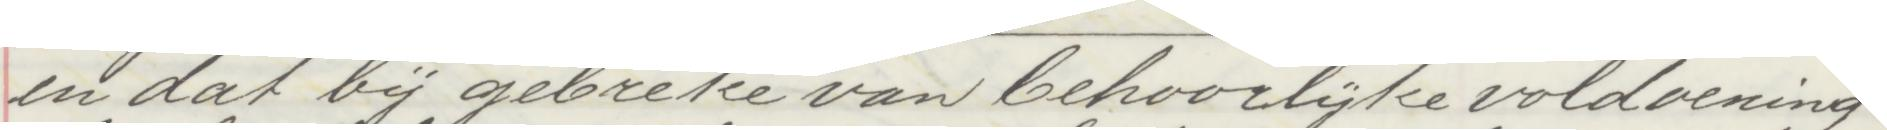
en dat bij gebreke van behoorlijke voldoening
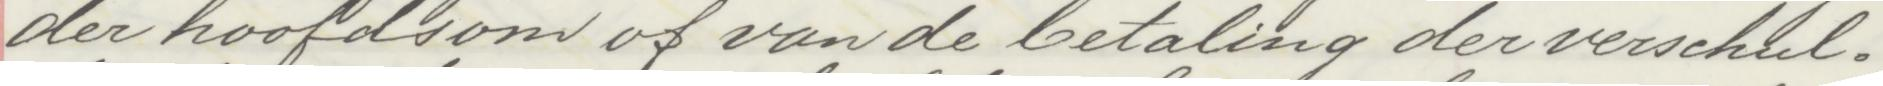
der hoofdsom of van de betaling der verschul=
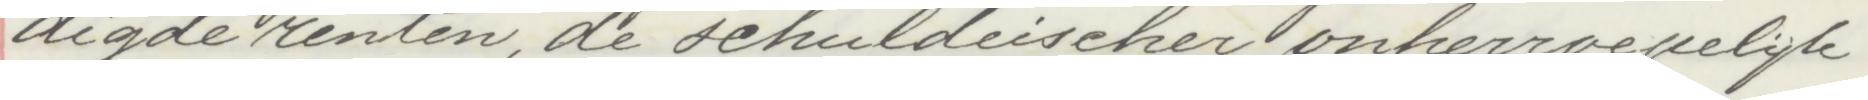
digde renten, de schuldeischer onherroepelijk
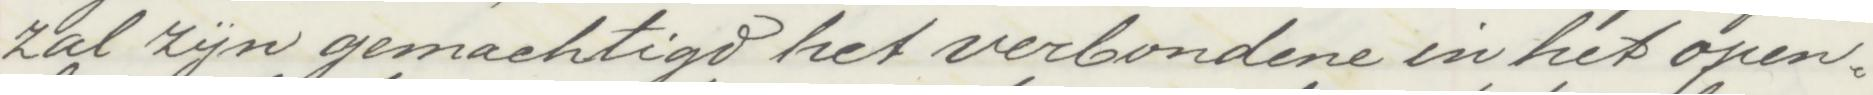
zal zijn gemachtigd het verbondene in het open=
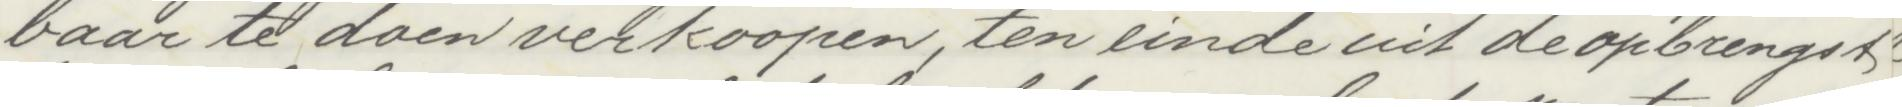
baar te doen verkoopen ten einde uit de opbrengst
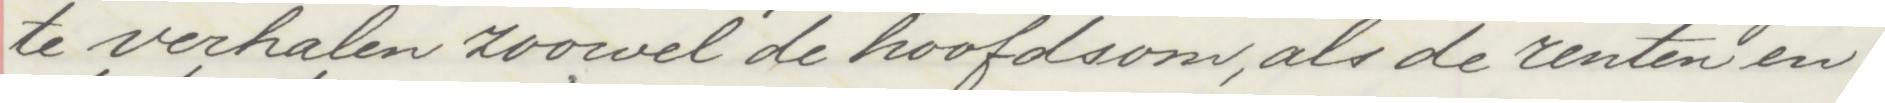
te verhalen zoowel de hoofdsom, als de renten en
